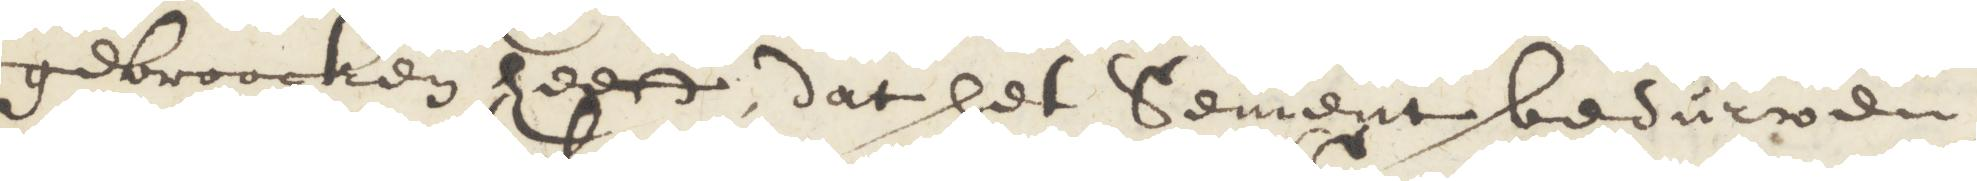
gebroocken heeft, dat het Sement bedurven
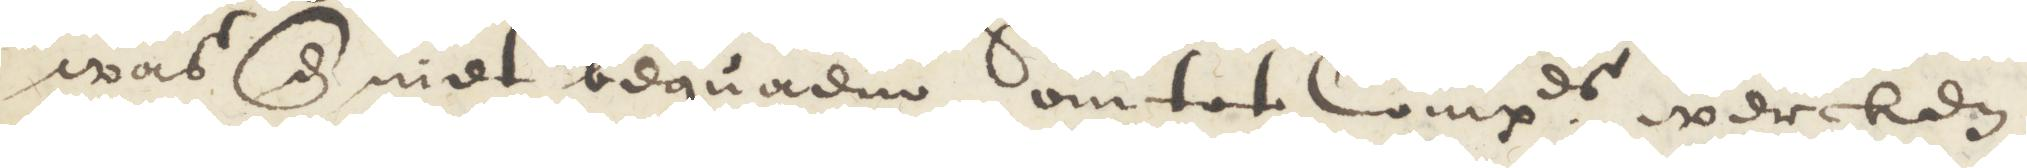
was ende niet bequaem, om tot Comp:es wercken
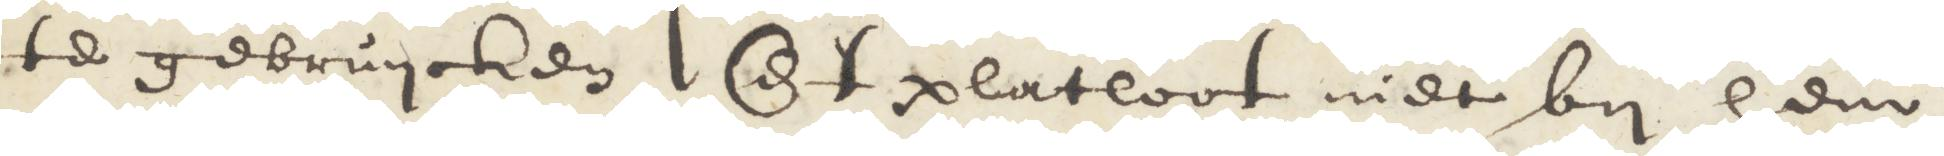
te gebruycken, ende 't platloot niet by hem
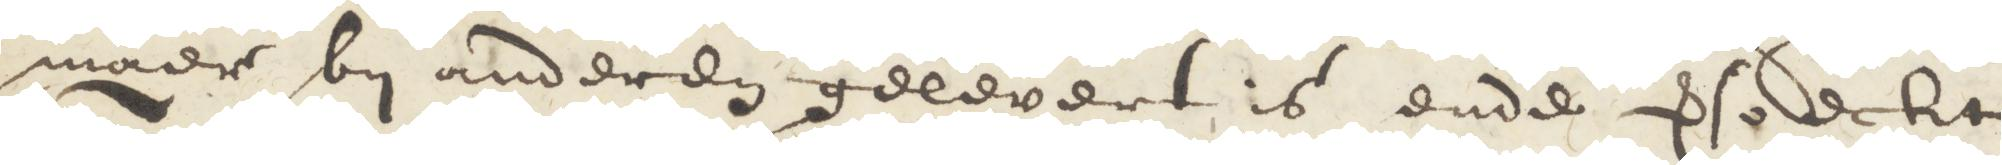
maer by anderen gelevert is ende versoeckt
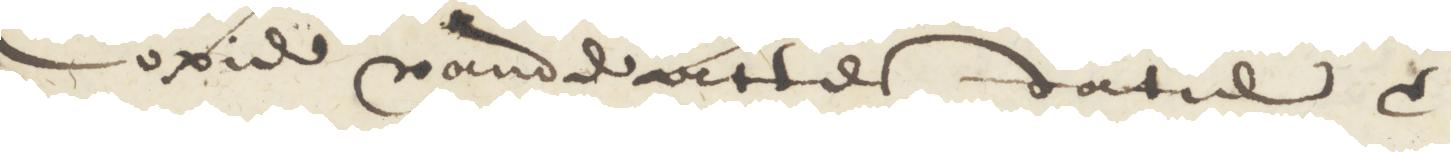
Copie vande attestatie -
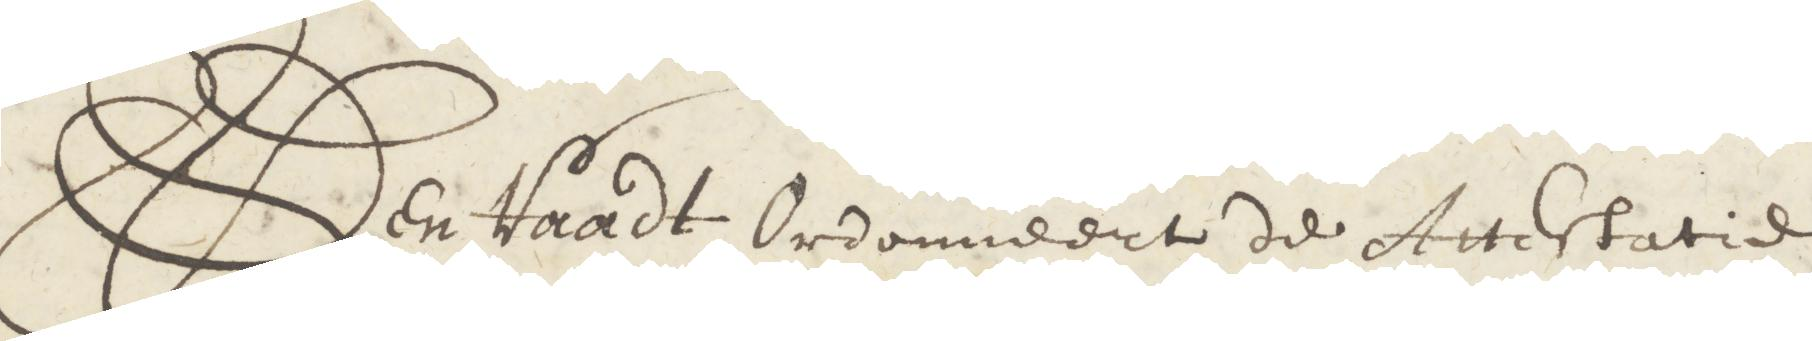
Den Raadt, Ordonneert de Attestatie
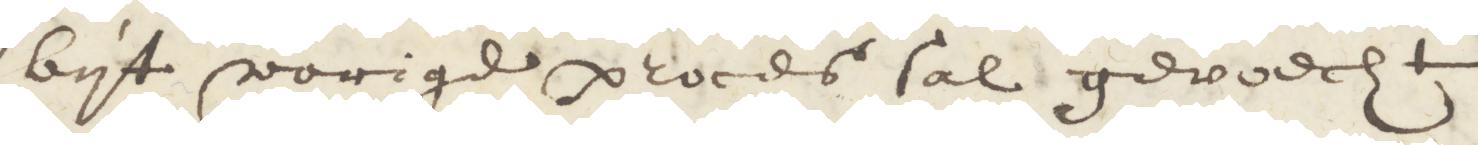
by 't vorige proces sal gevoecht
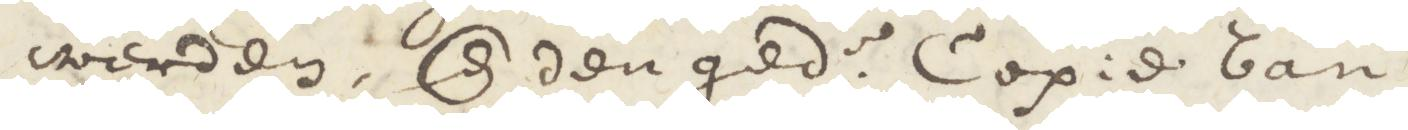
werden, ende den ged.e Copie van
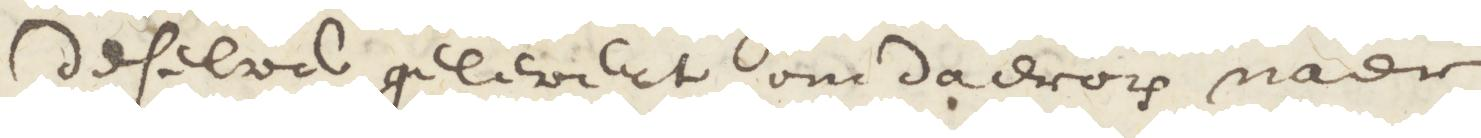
deselve gelevert, om daerop naer
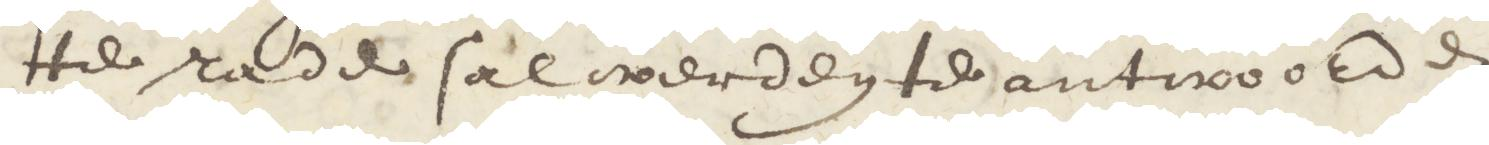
te rade sal werden te antwoorden
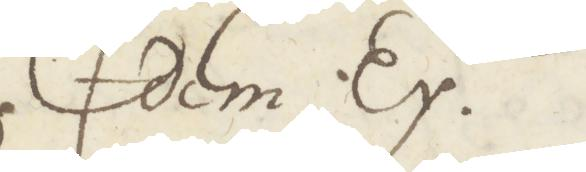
Idem Ey.r
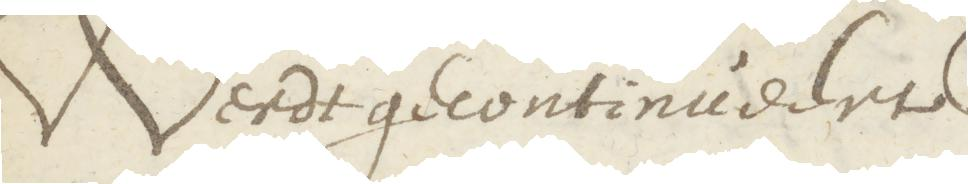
Werdt gecontinueert
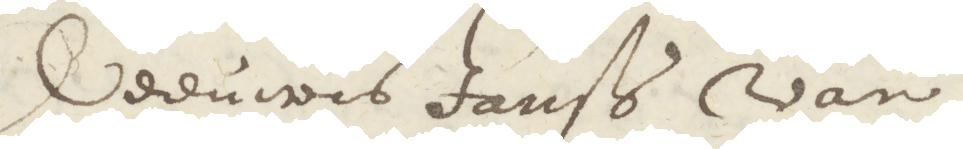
Teeuwis Janss van
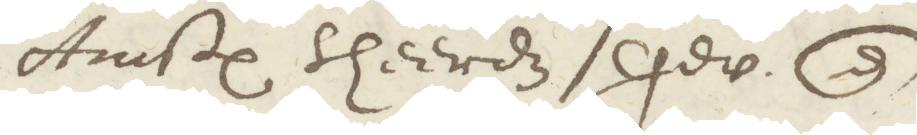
Amst s heeren gev. ende
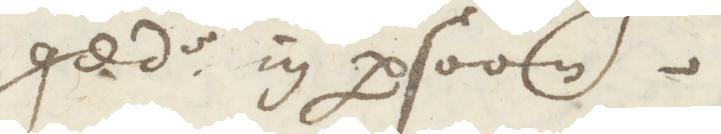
ged.e in persoon —
